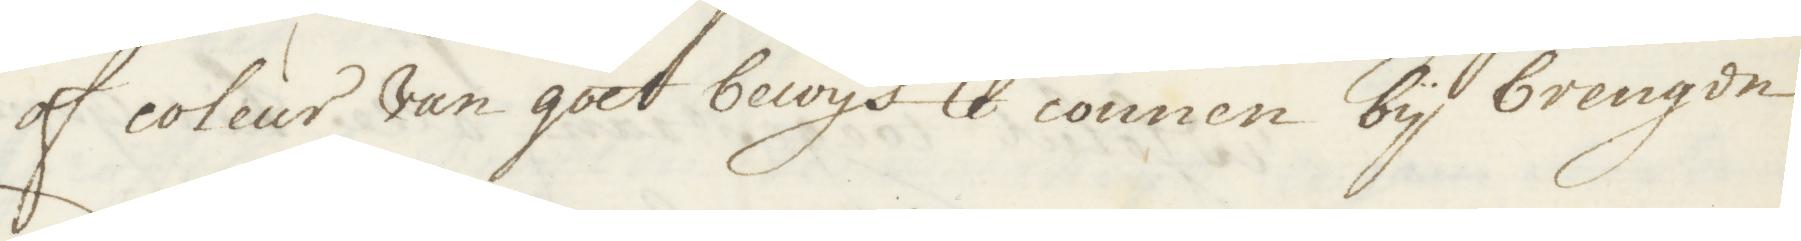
of coleur van goet bewijs te connen bij brengen
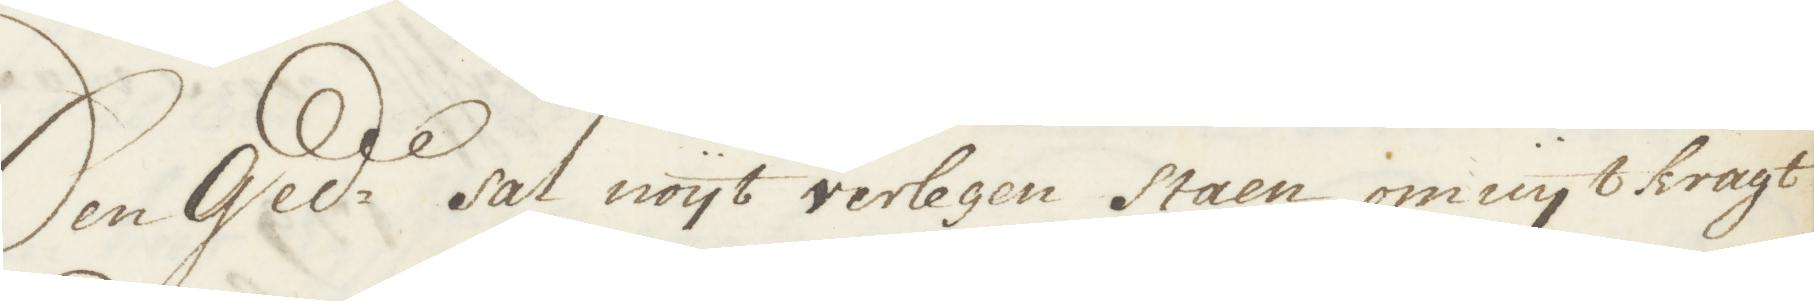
Den Ged=e sal noijt verlegen staen, om uijtkragt
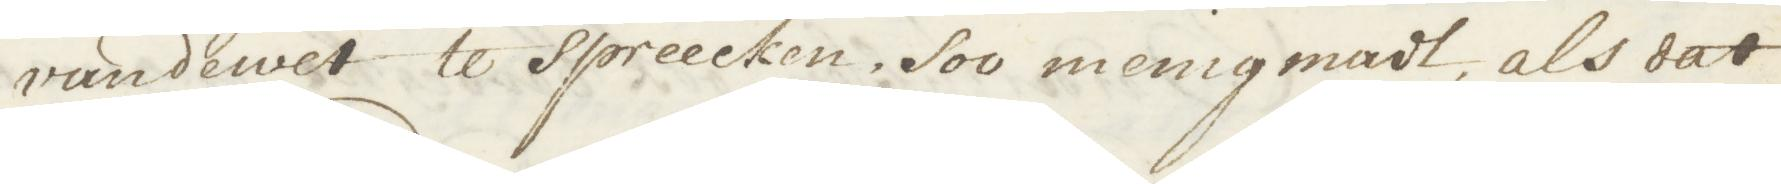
van de wet te spreecken, soo menigmael, als dat
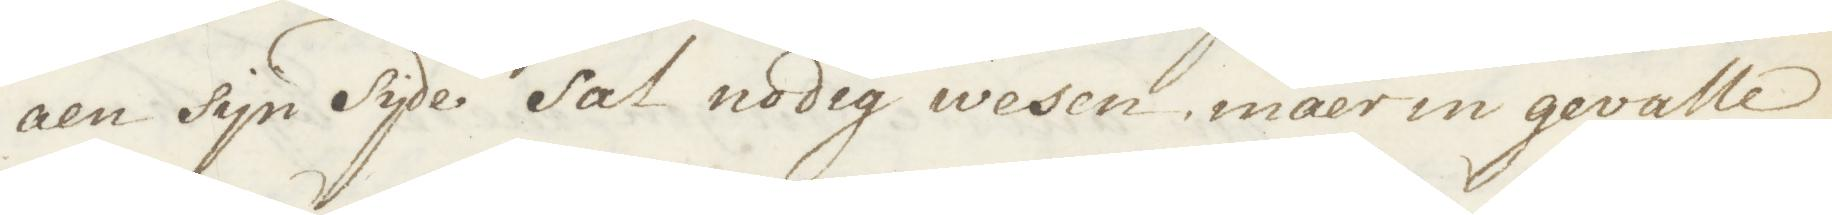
aen sijn sijde sal nodig wesen, maer in gevalle
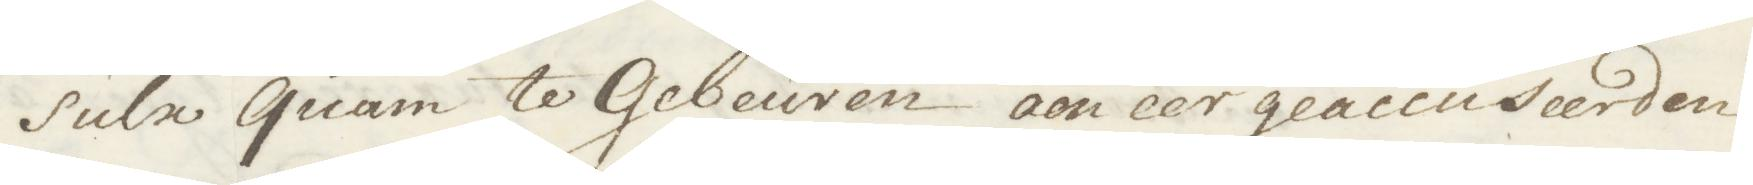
sulx quam te gebeuren aen eer geaccuseerden
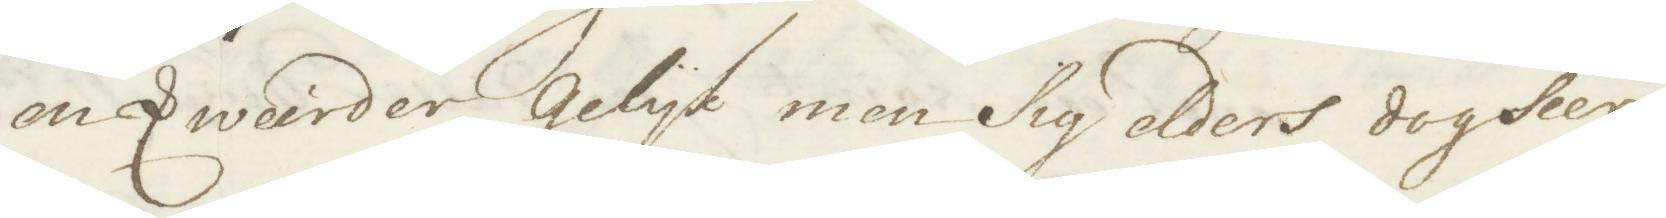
en verweirder, gelijk men sig alders dog seer
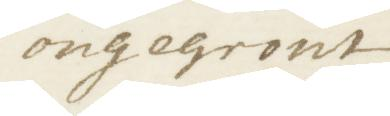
ongegront
